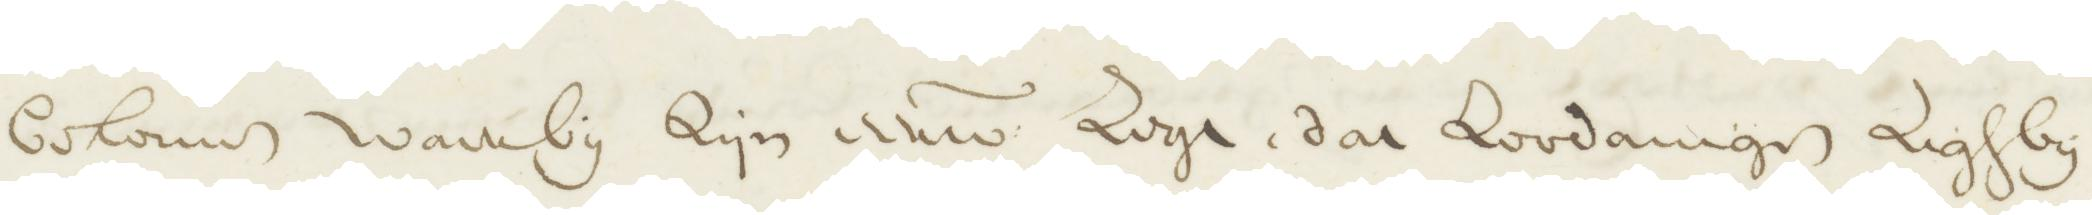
bekomen waerbij zijn eerw: zegt, dat zoodanigen zigh bij
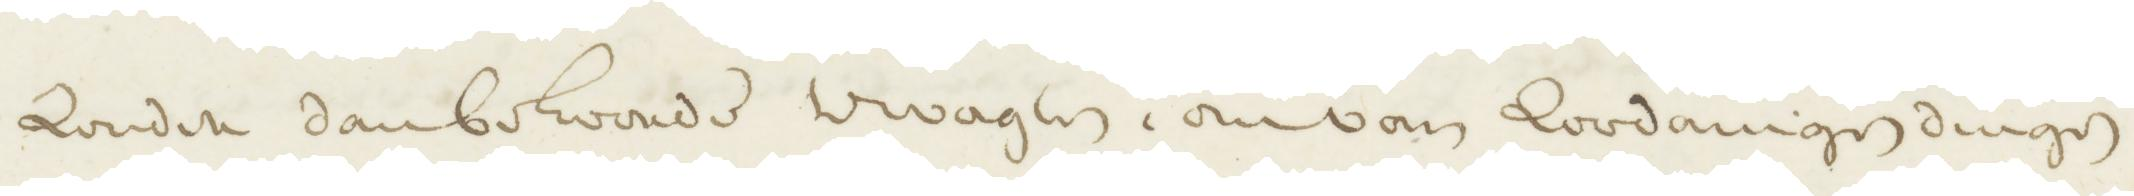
zonder dan behoorde tewagten, om van zoodanigen dingen
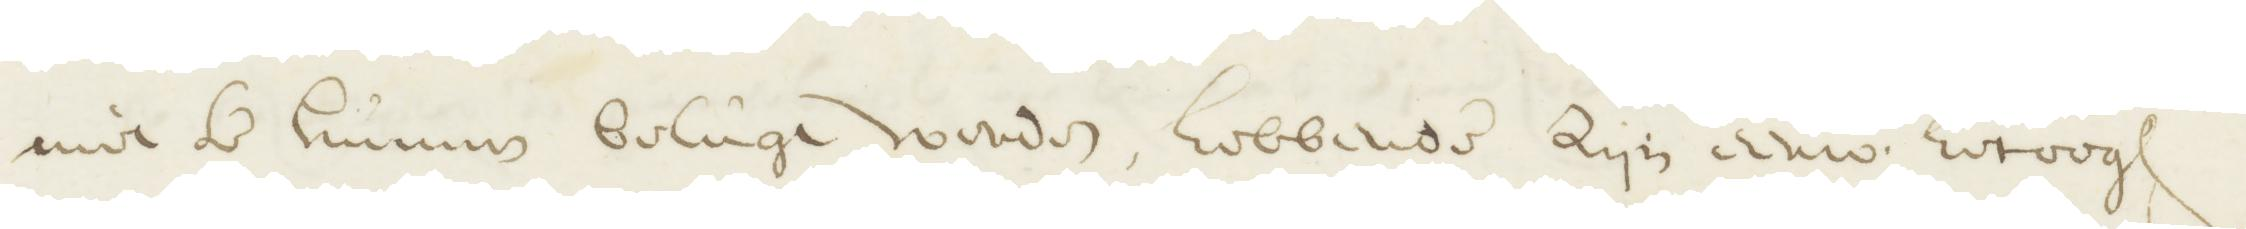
niet te kunnen betugt werden, hebbende zijn eerw: het oogh
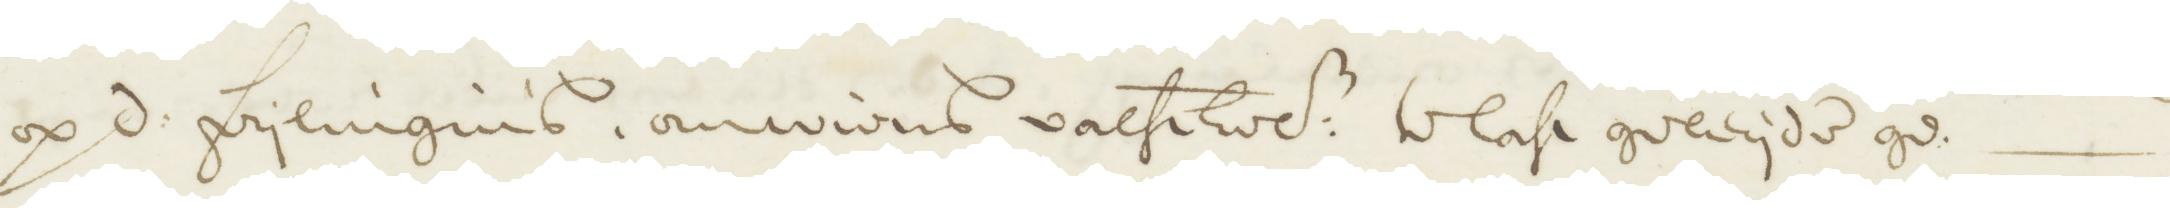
op d: feijlingius, om wiens valschelijk te last geleijde ge:
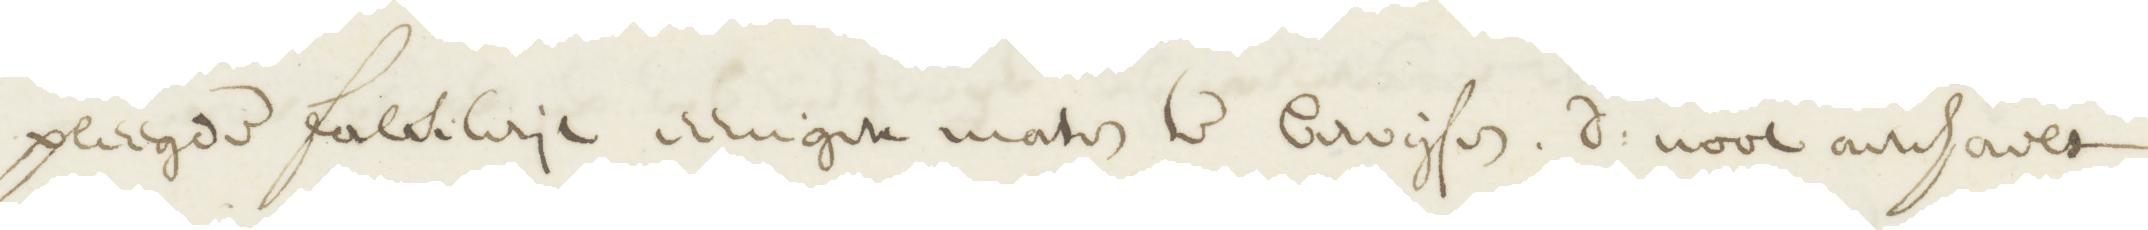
pleegde falscheijt eeniger maten te bewijsen. d: noot aenhaelt
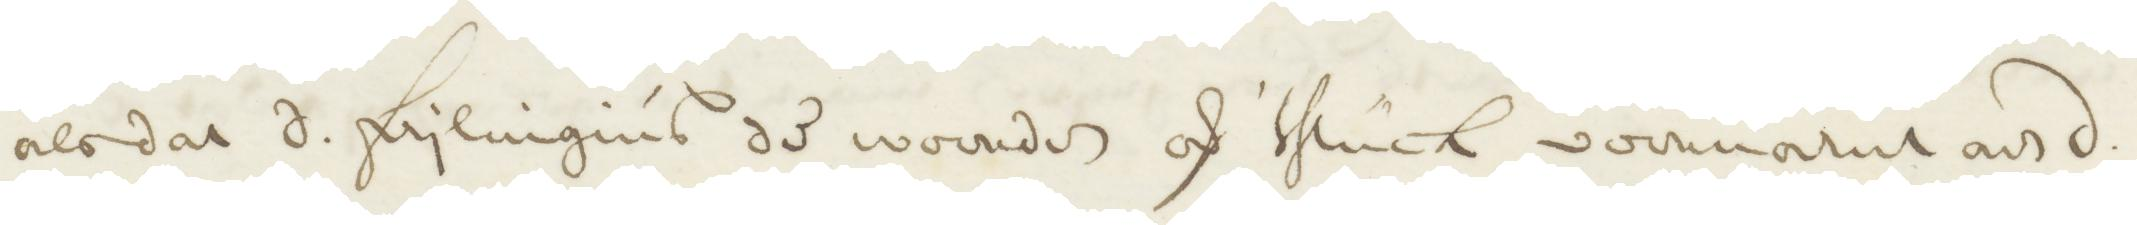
als dat d. feijlingius de woorden over 'tstuck voornoemt aen d.
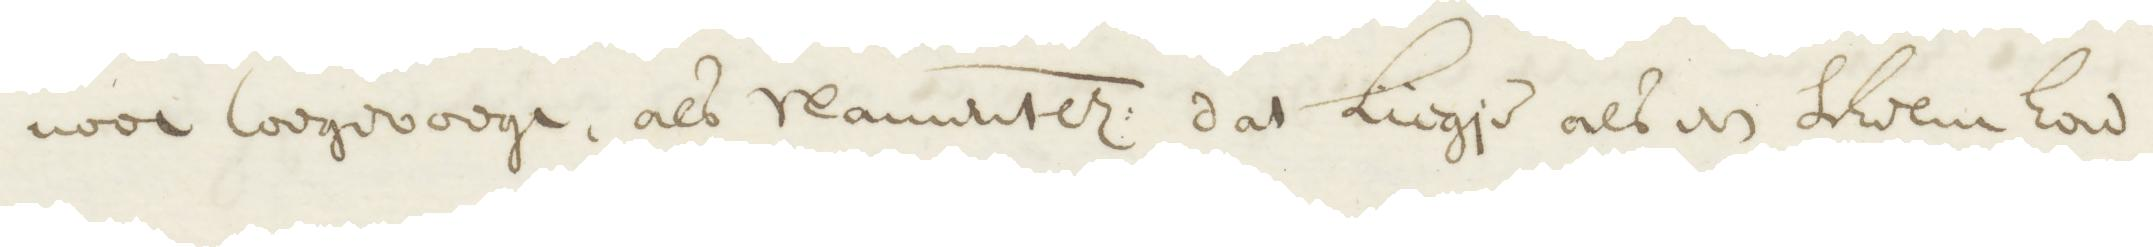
noot toegevoegt, als Namentlijk dat liegje als een schelm had
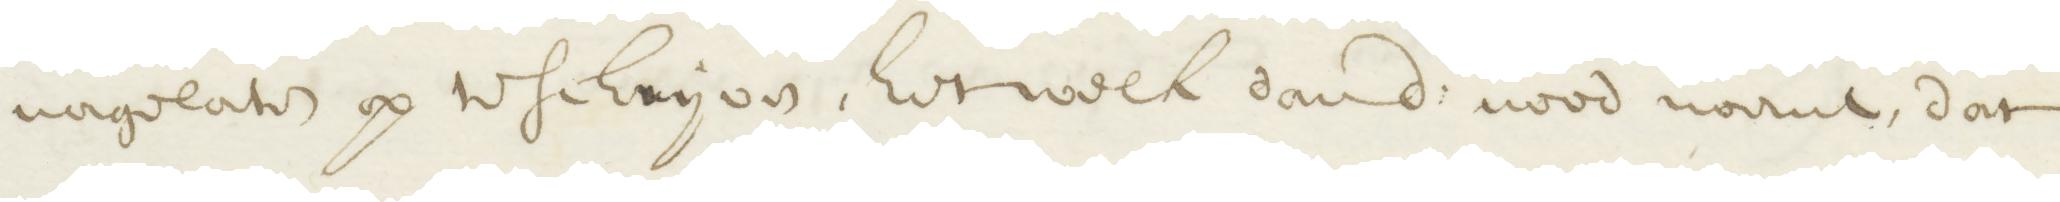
nagelaten op te schrijven, het welk dan d: nood noemt, dat
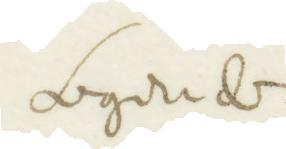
tegen de
